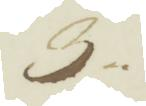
3 „ —
